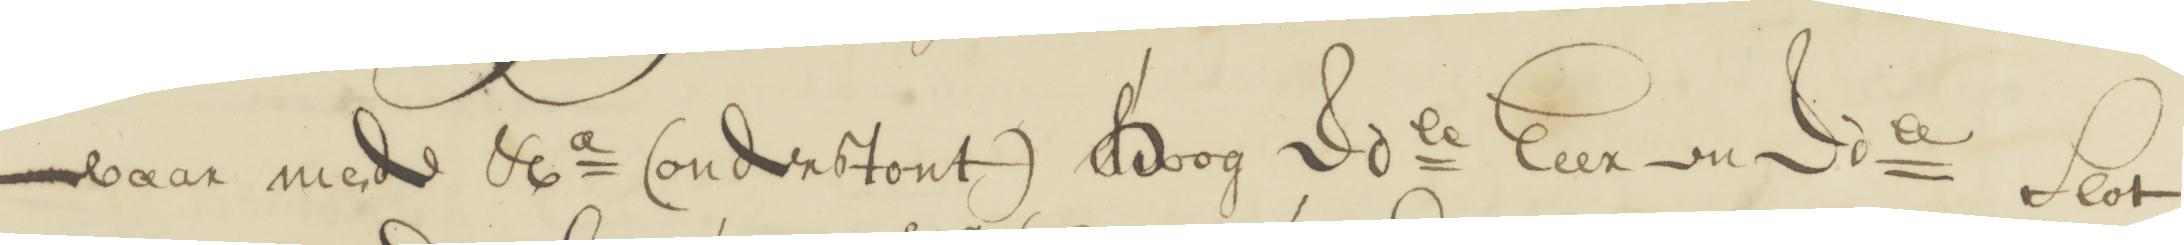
waar mede etc=a (onderstont) Hoog Ed=le heer en Ed=le slot
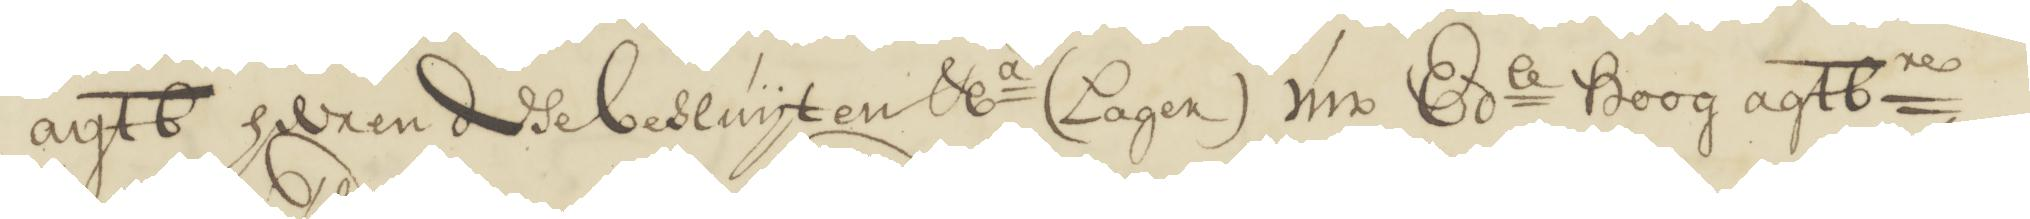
agtb: heeren dese besluijten etc=a (lager) uw Ed=le Hoog agtb=re
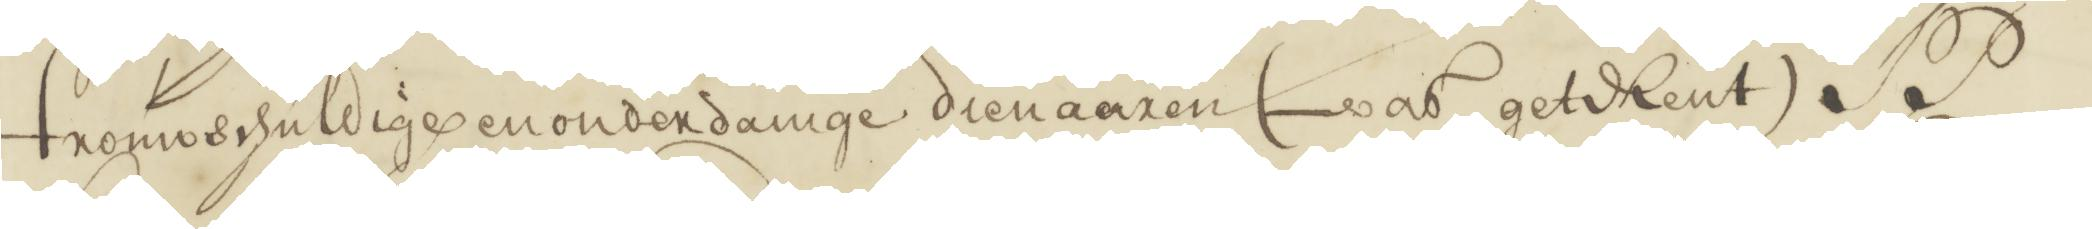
trouwschuldige en onderdanige dienaaren (was getekent) IP
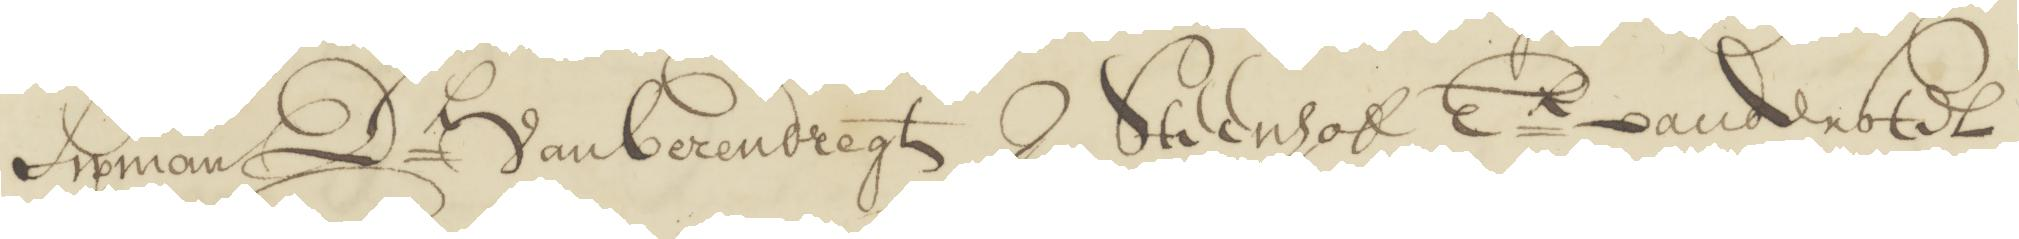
Sipman D=k Van berendregt J steenhof E=k vander stel
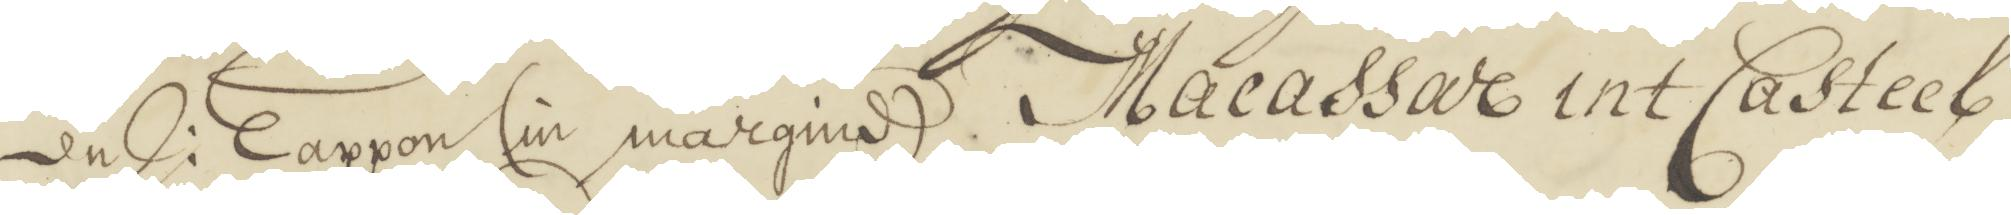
en J: Cappon (in margine) Macassar int Casteel
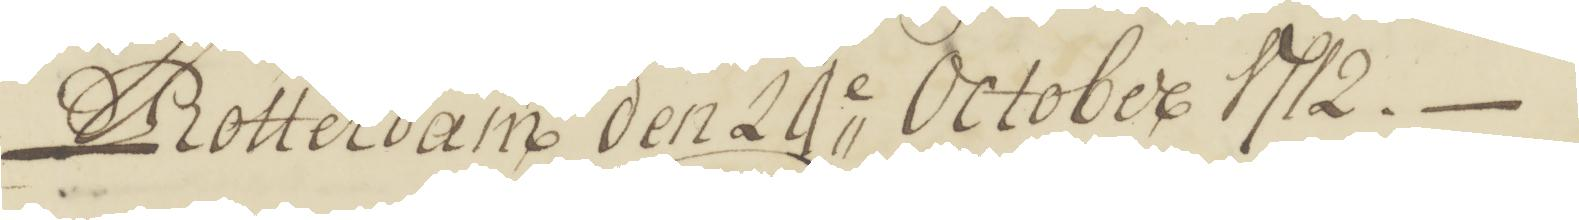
Rotterdam den 24„e October 1712. —
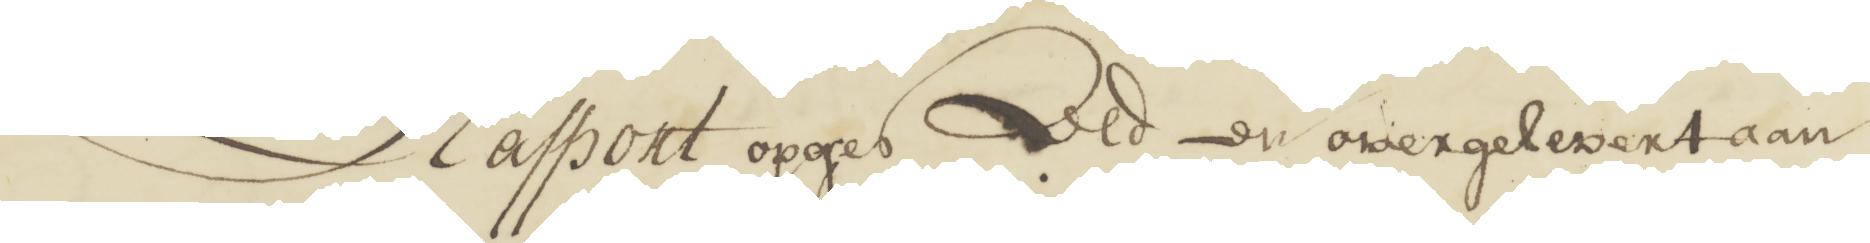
Rapport opgesteld en overgelevert aan
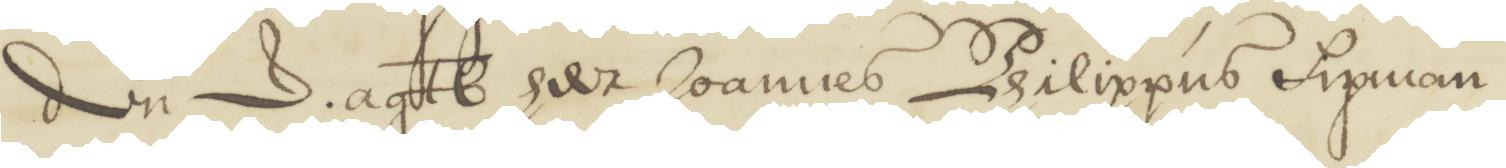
den E. agtb heer Joannes Philippus Sipman
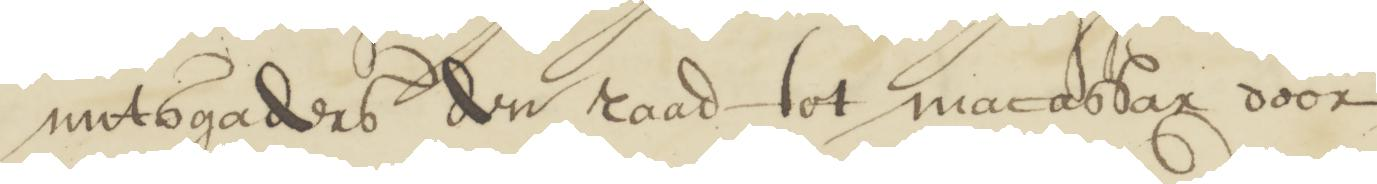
mitsgaders den raad tot macassar door
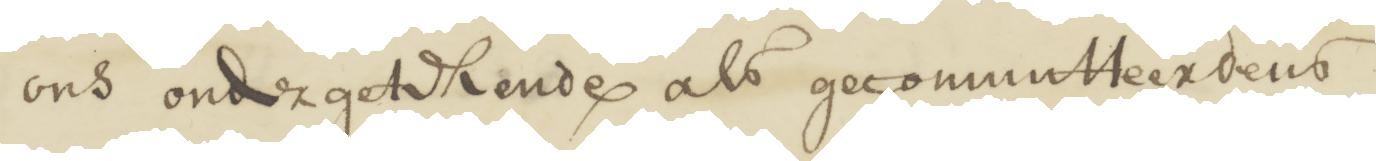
ons ondergetekende als gecommitteerdens
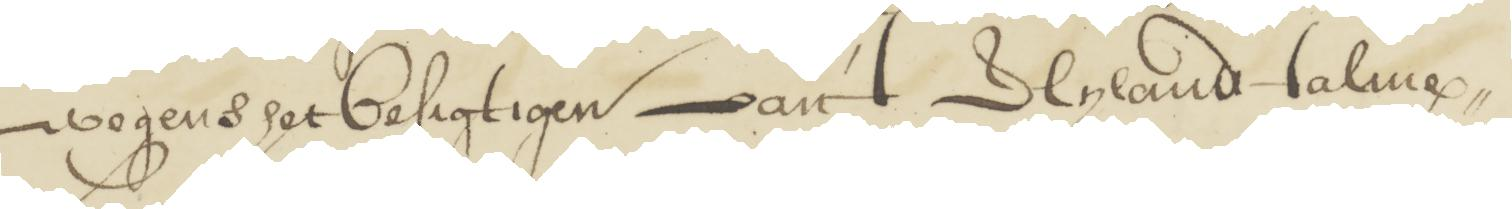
wegens het besigtigen van ’t Elyland talme„
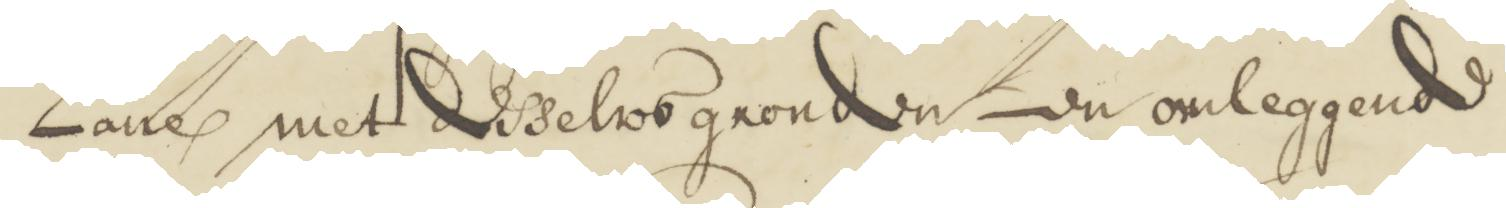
Lane met desselvs gronden en omleggende
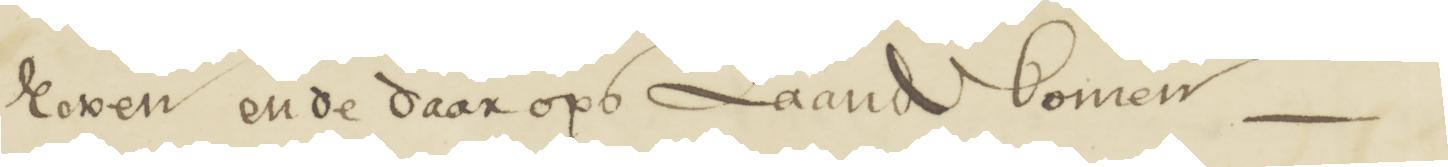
hoven en de daar opstaande bomen —
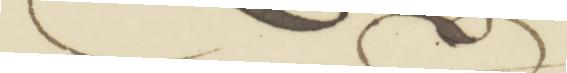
E E
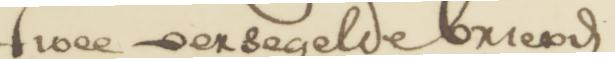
twee versegelde brieven
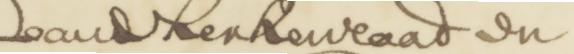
vande kerkenraad en
